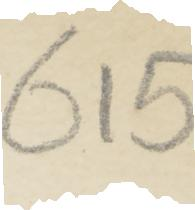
615
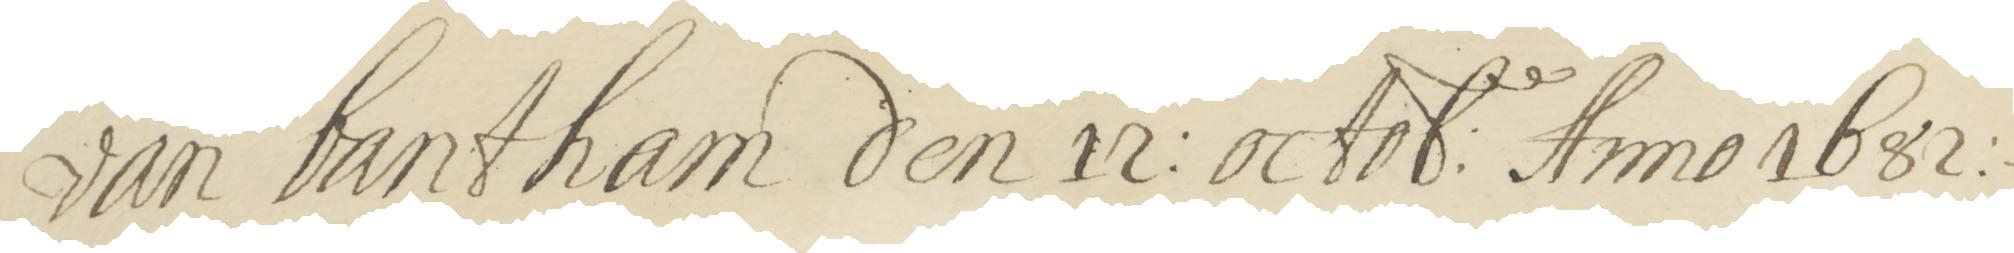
van bantham den 12: octob:e Anno 1682:
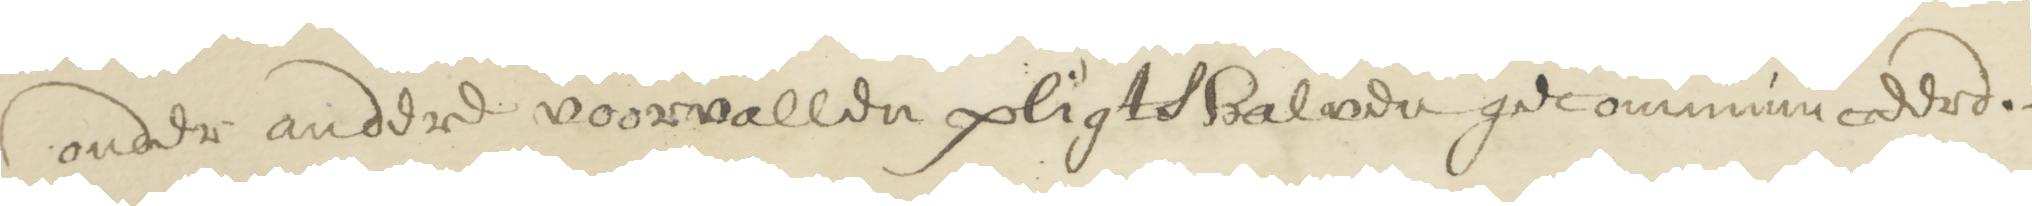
onder andere voorvallen pligtshalven gecommuniceerd.
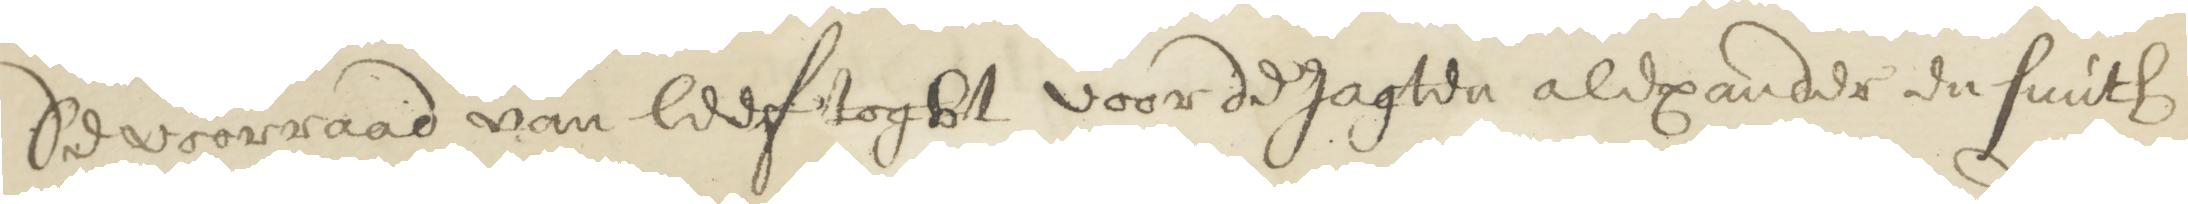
de voorraad van leeftoght voor de Jagten alexander en smith
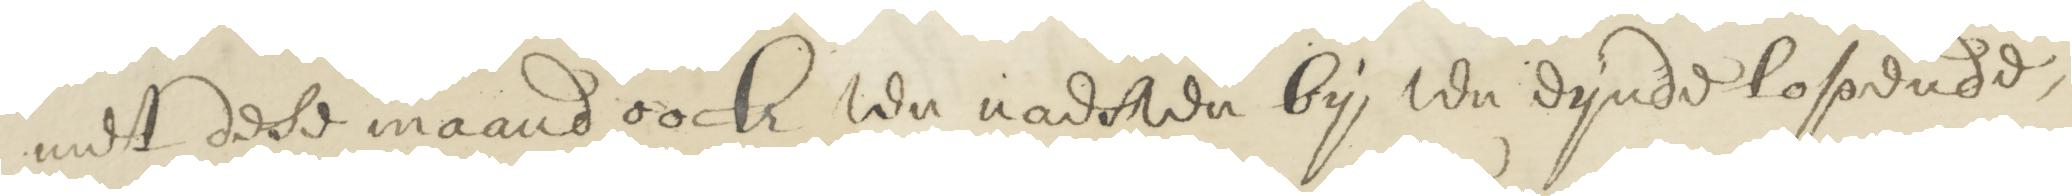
met dese maand oock ten naesten bij ten eijnde lopende,
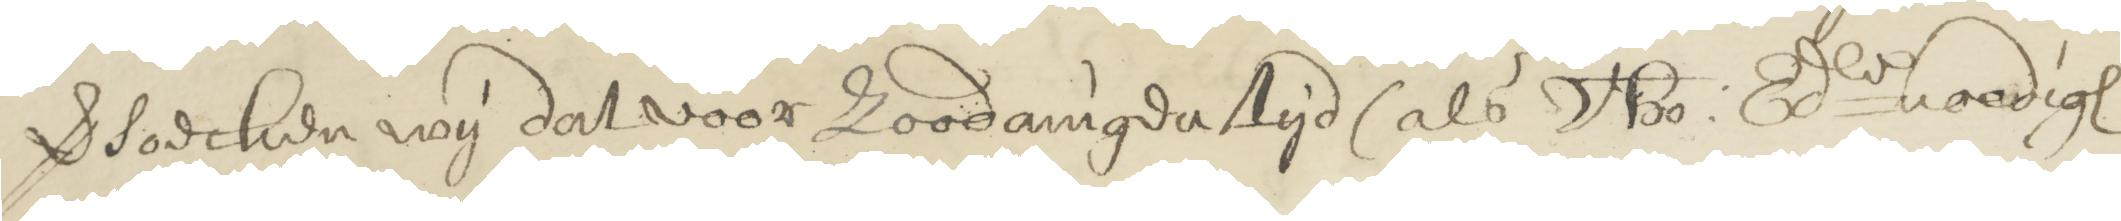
versoecken wij dat voor zoodanigen tijd (als Uho: E=le noodigh
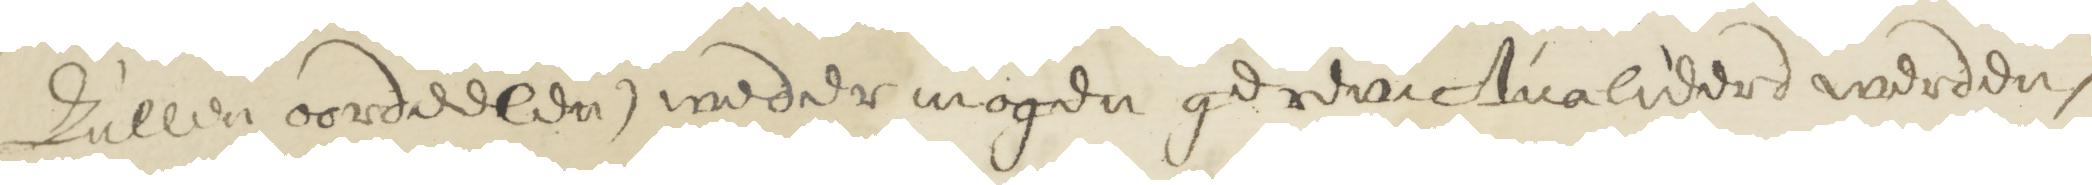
zullen oordeelen) weder mogen gerevictualieerd werden,
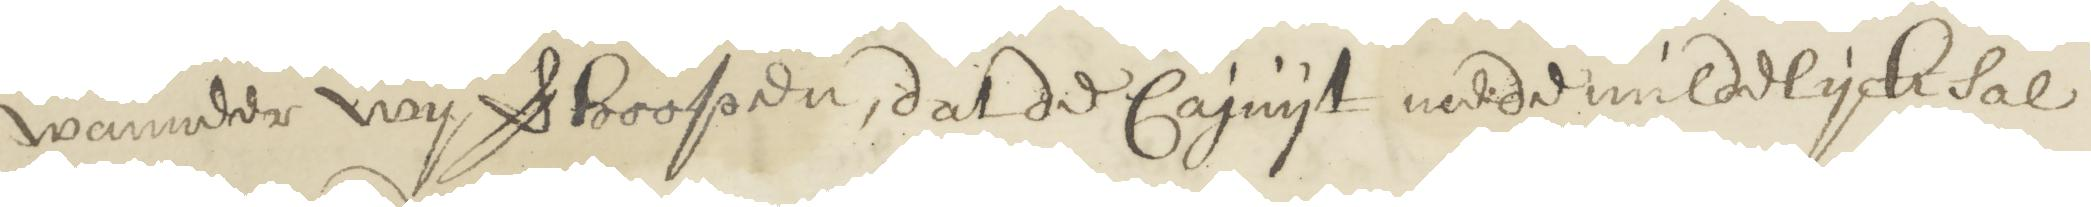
wanneer wy verhoopen, dat de Cajuijt mede mildelijck sal
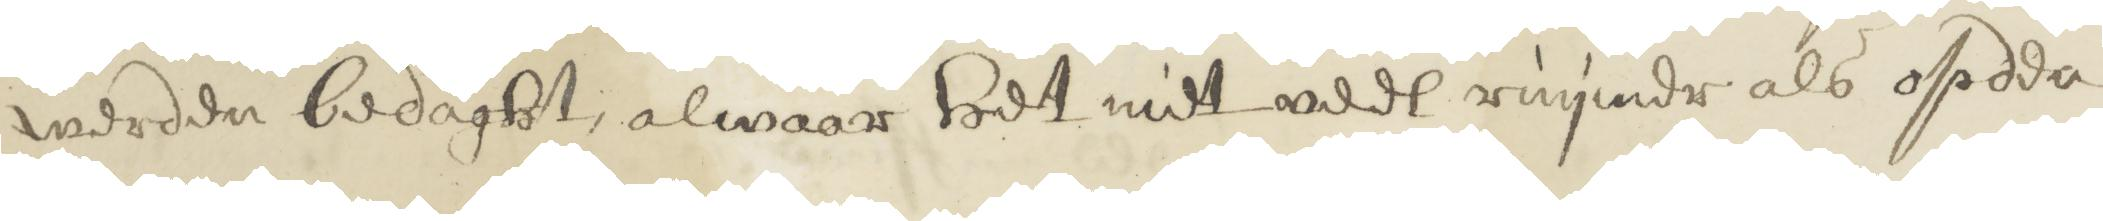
werden bedaght, alwaar het niet veel ruijmer als op den
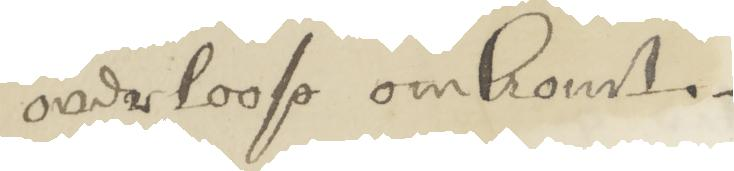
overloop omkomt.
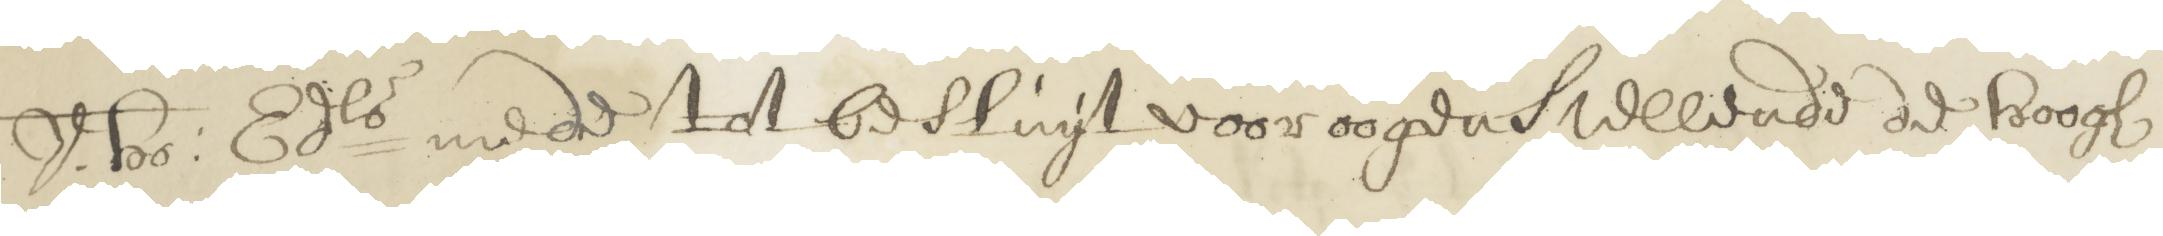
U.ho: Ed=ls mede tot besluijt voor oogenstellende de hoogh
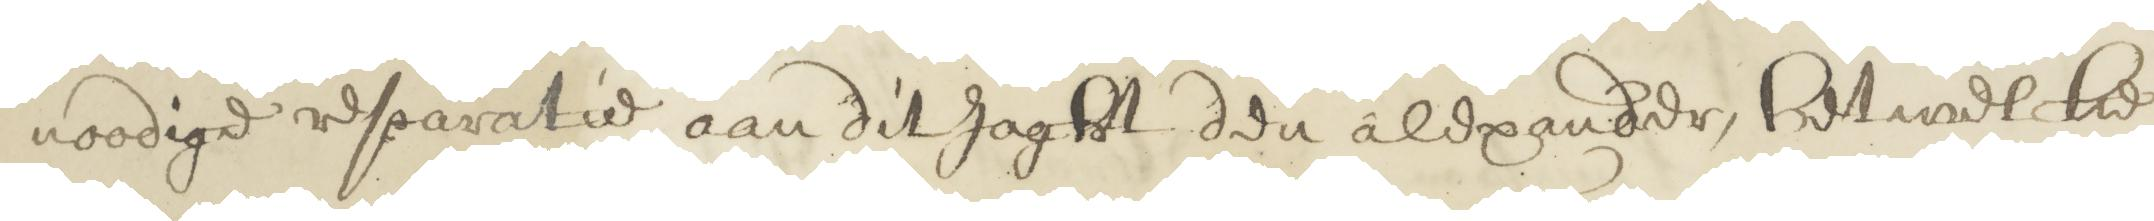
noodige reparatie aan dit jaght den alexander, het welcke
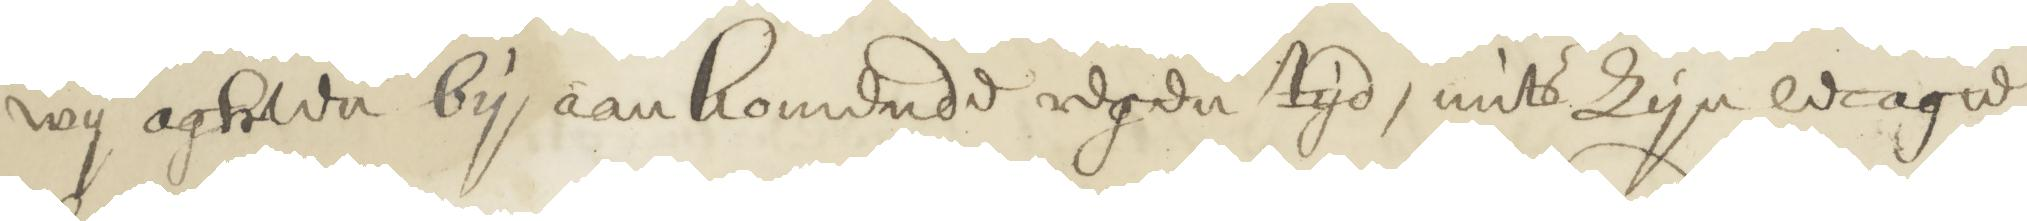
wy aghten bij aankomende regen tijd, mits zijn lecagie
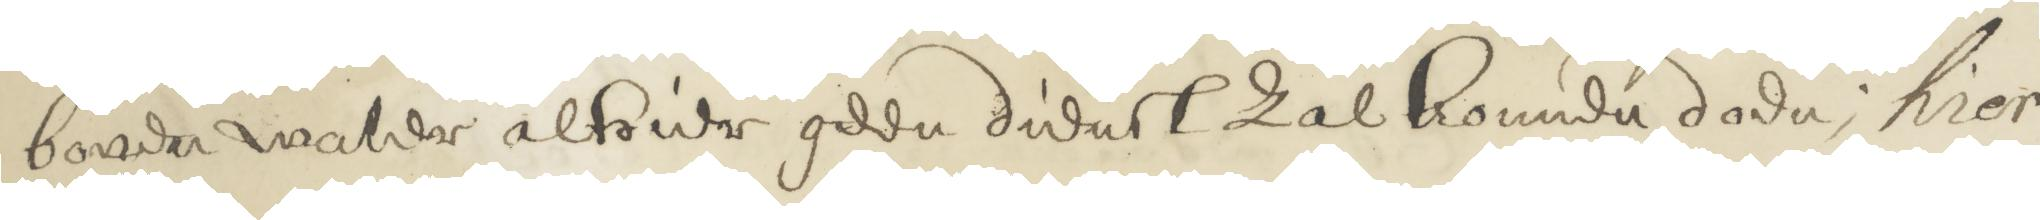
boven water alhier geen dienst zal konnen doen; hier
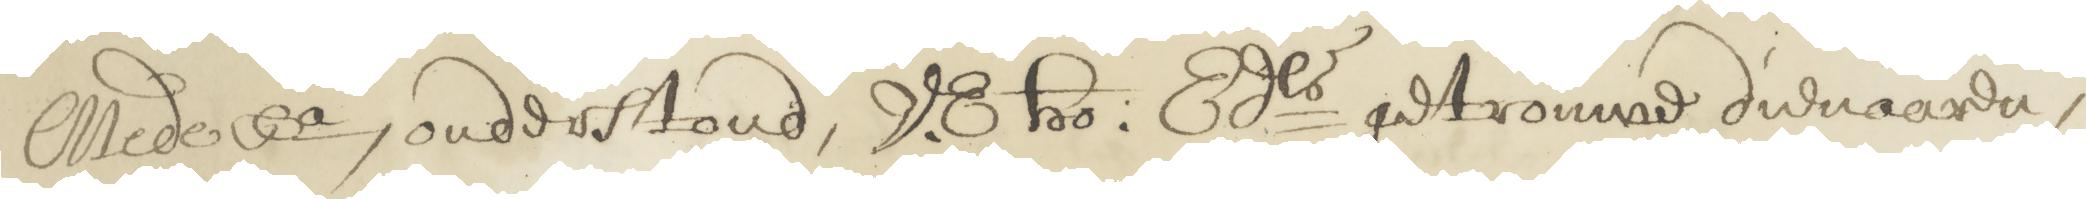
Mede So, onderstond, V.E ho: Ed=ls getrouwe dienaaren,
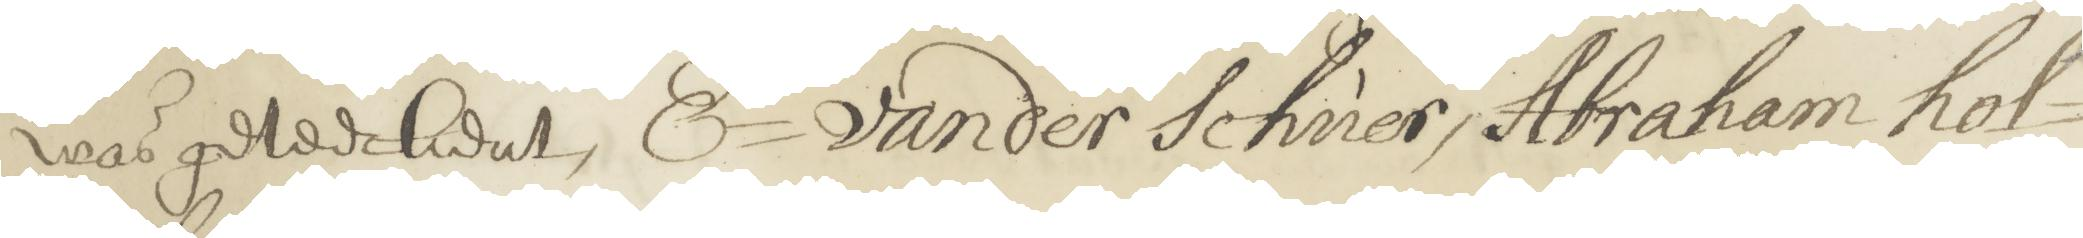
was geteeckent, E= van der schuer, Abraham hol=
